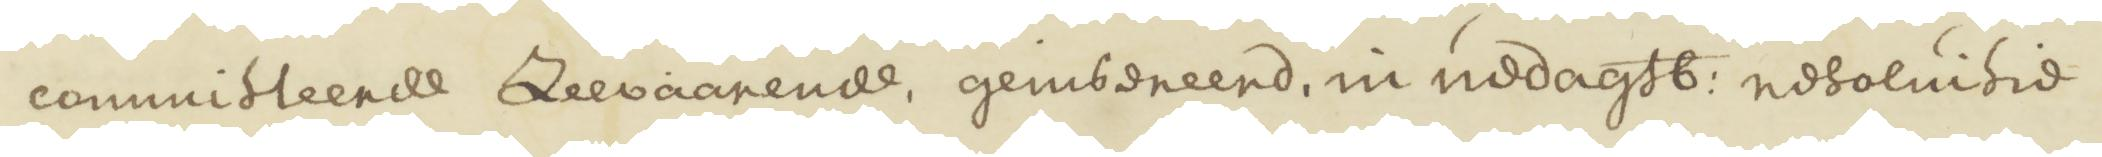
committeerde zeevaarende, geinsereerd, in u Ed agtb: resoluitie
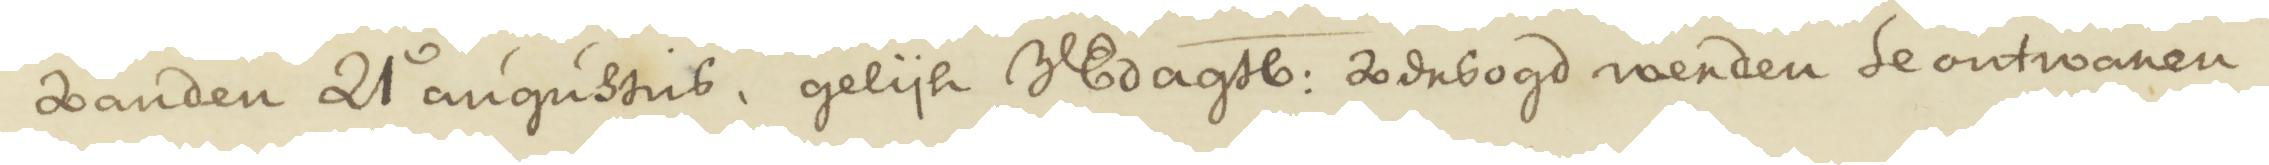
van den 21' augustus, gelijk VEd agtb: versogd werden te ontwaren
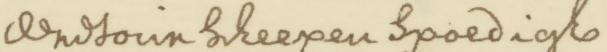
de retour scheepen spoedigh
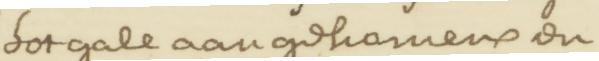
tot gale aangekomen en
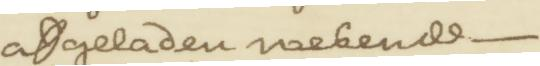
afgeladen wesende
